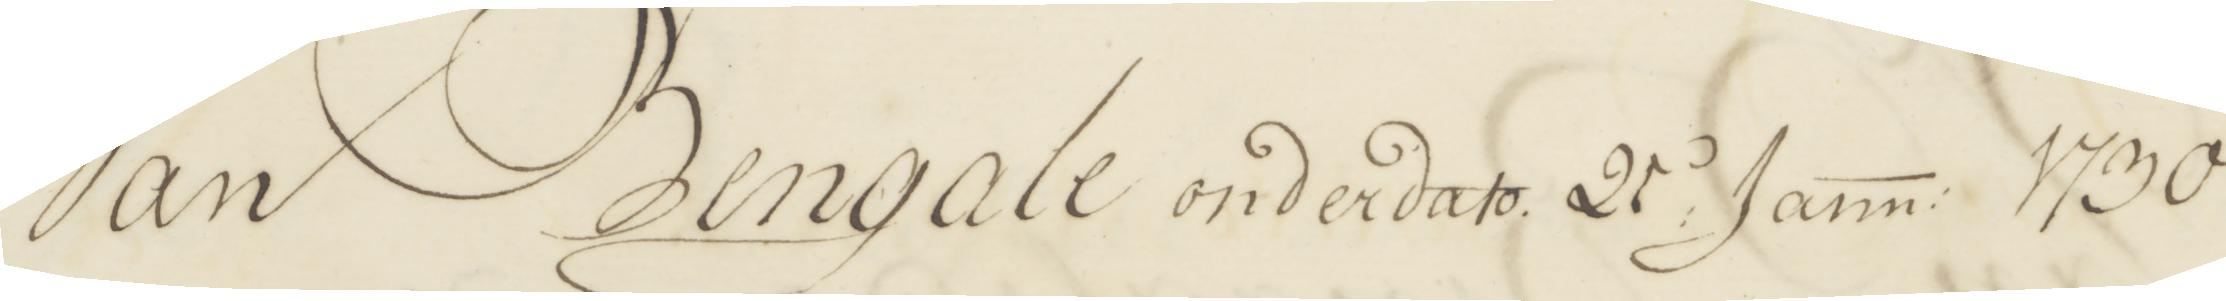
van Bengale onder dato 25' Janu: 1730
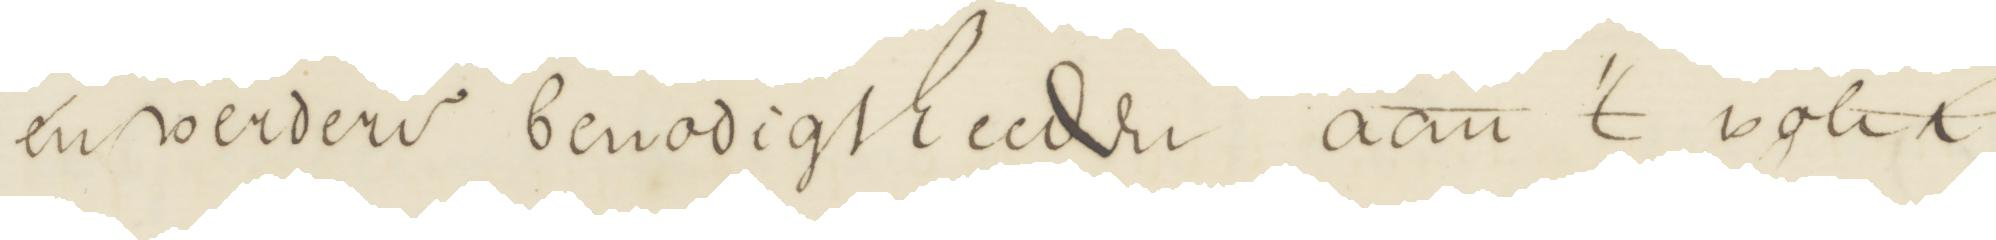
en verdere benodigtheeden aan ’t volck
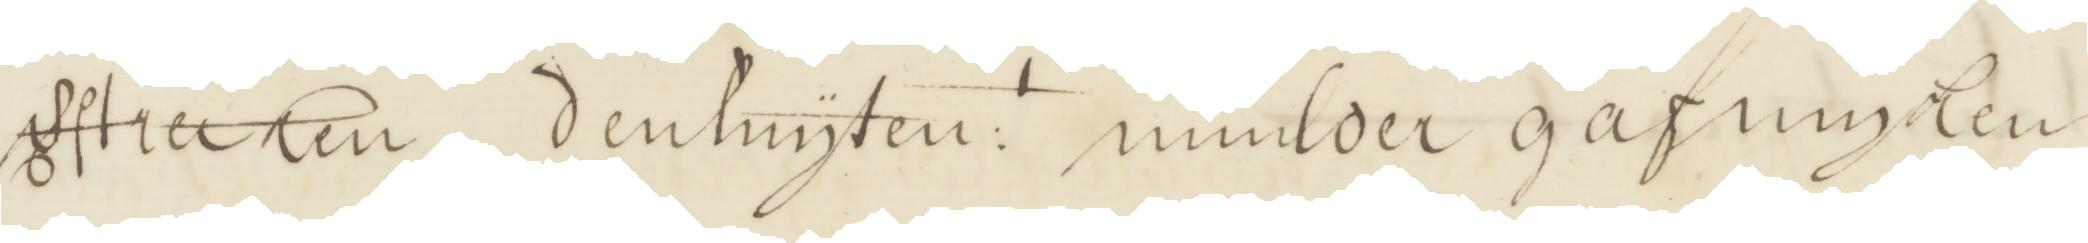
verstrecken denluijten:t muilder gaf my ken
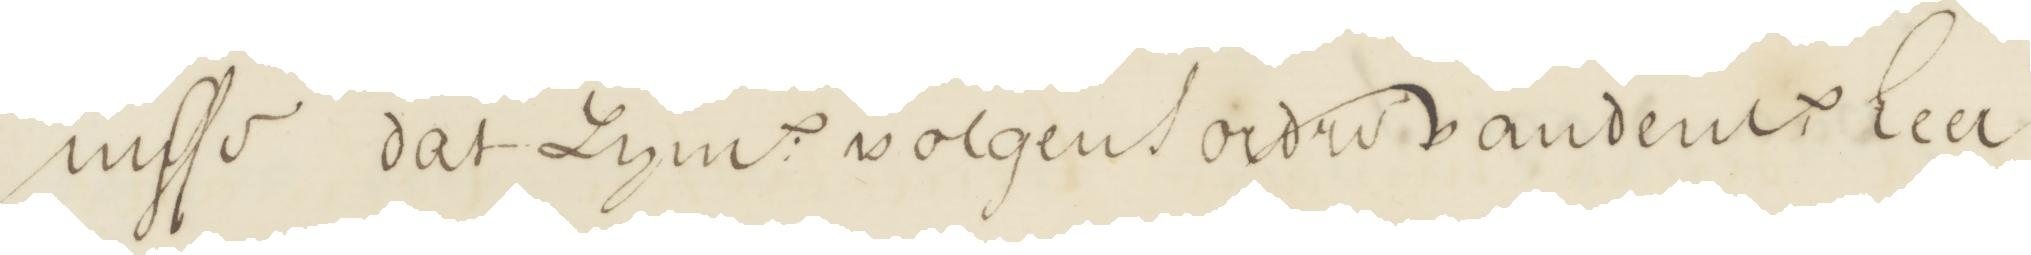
nisse dat zyne: volgens ordre van den E: heer
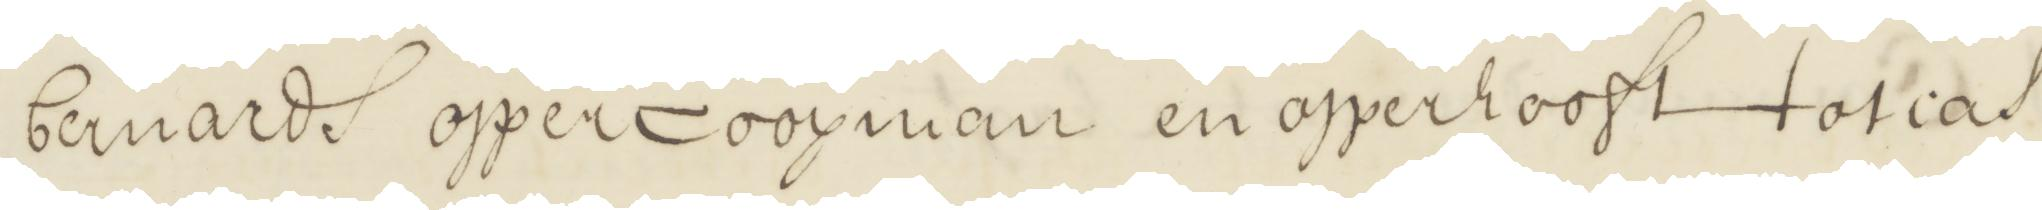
bernards oppercoopman en opperhooft tot cas
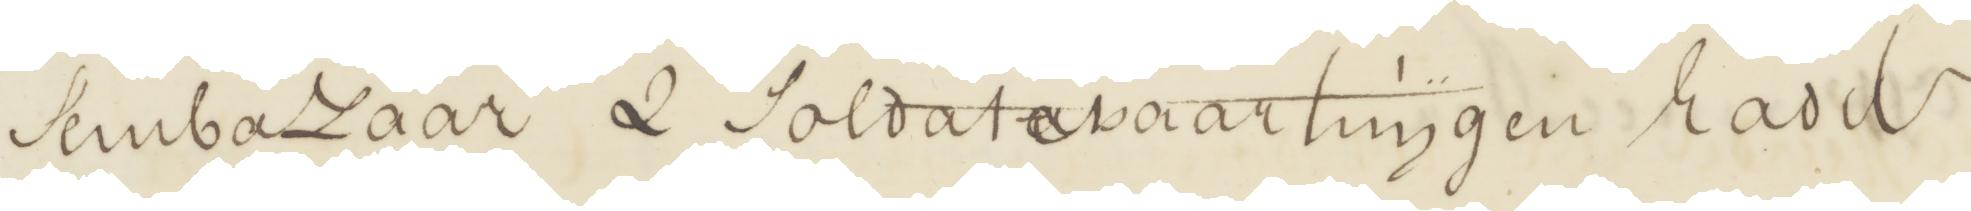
sembazaar 2 Soldate vaartuijgen hadde
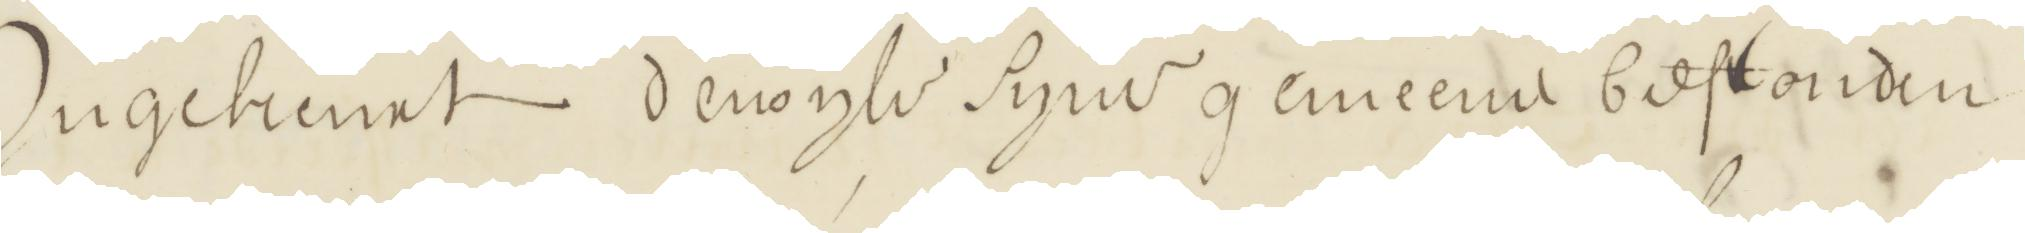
Ingekeurt dewyle syne gemeene bestonden
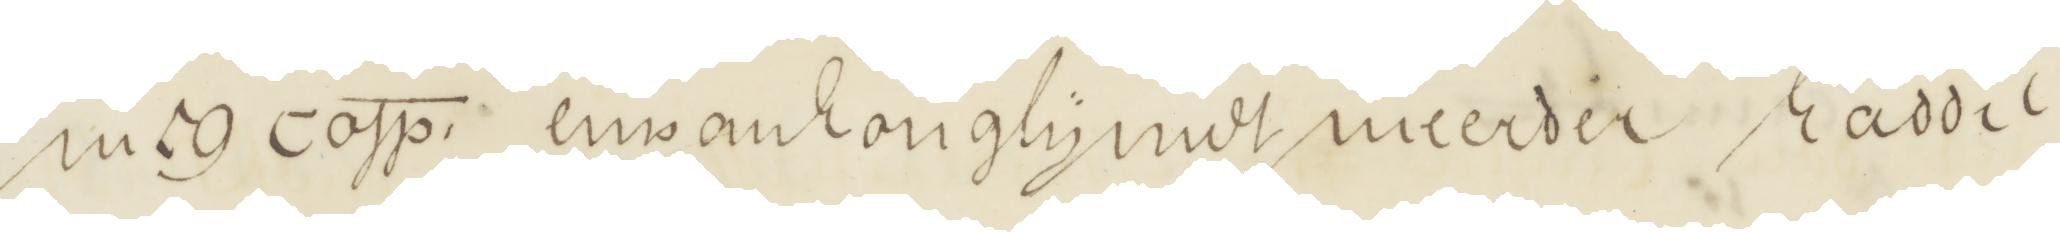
in 59 Copp. en van houglij met meerder hadde
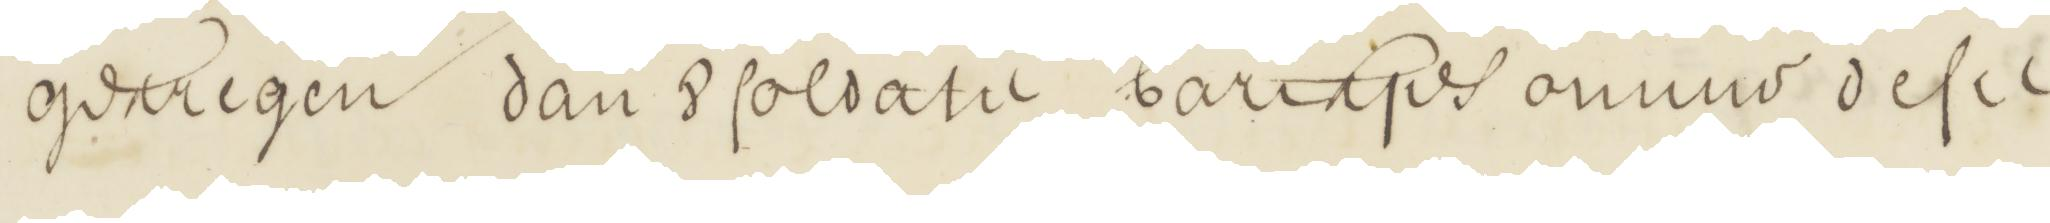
gekregen dan 8 soldate barctjes omme dese
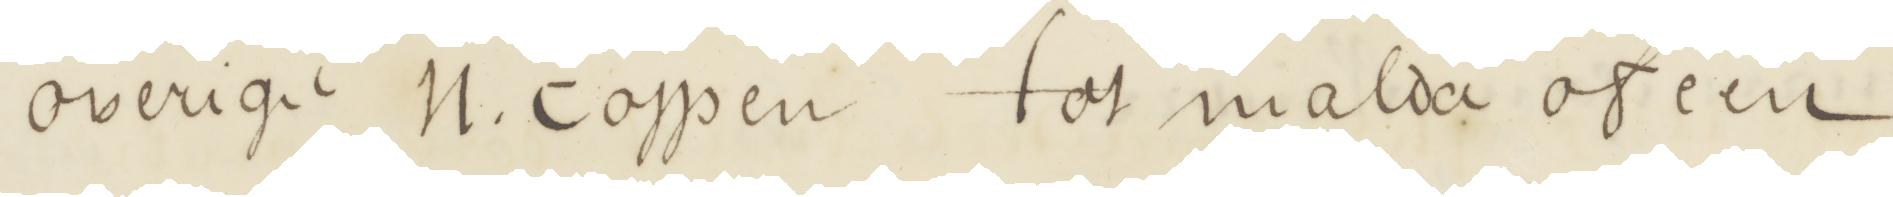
overige 11. Coppen tot malda of een
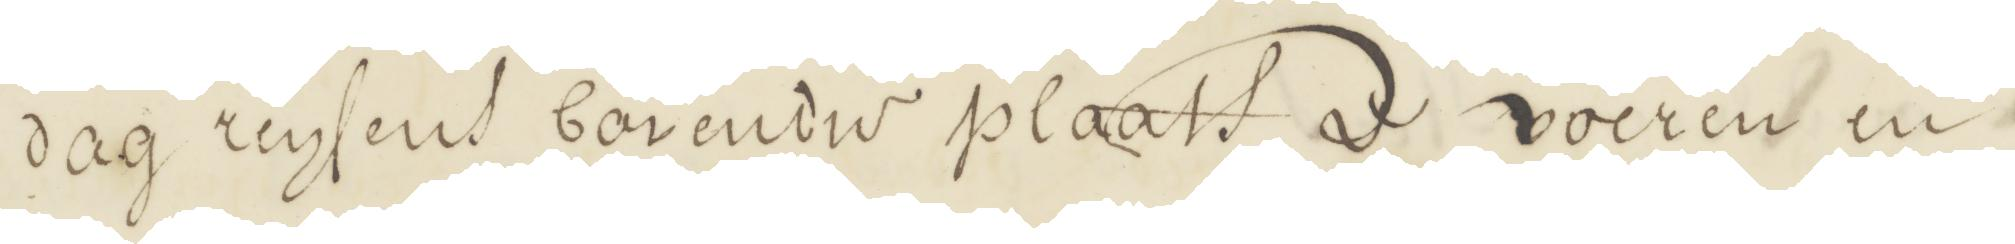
dag reysens bovendie plaats te voeren en
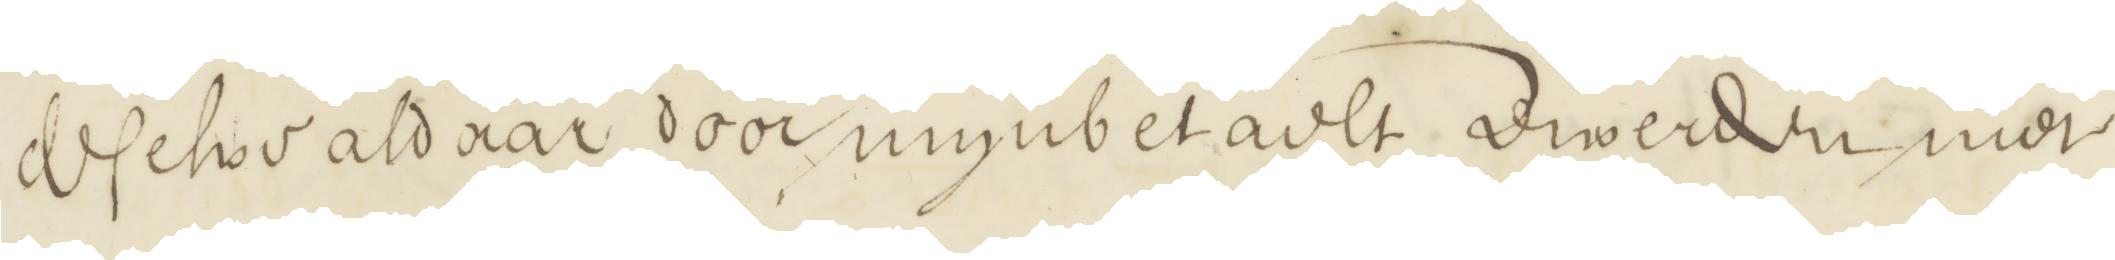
deselve aldaar door myn betaelt te werden met
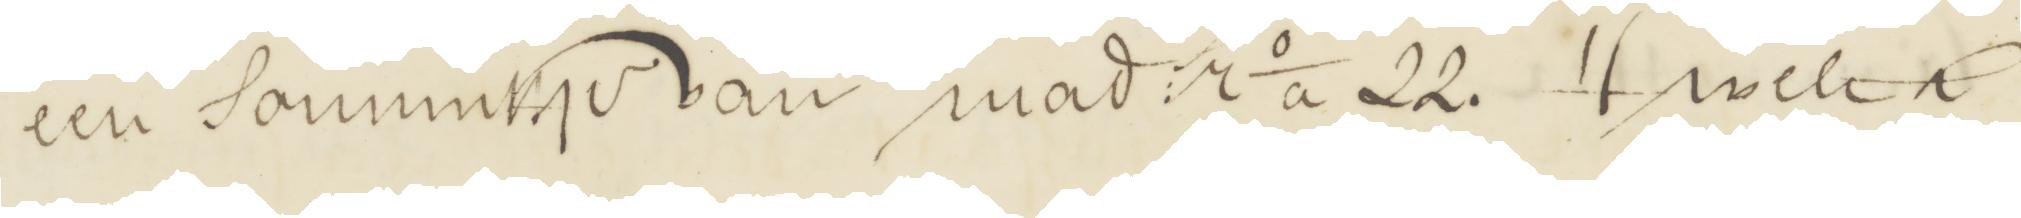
een sommittje van mad:s ro/a 22. 't welck
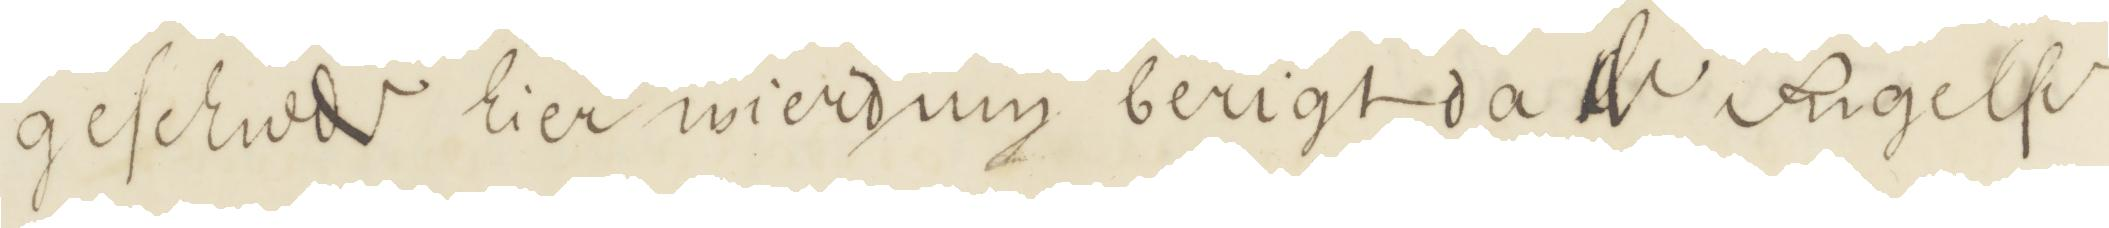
geschiede hier wierd my berigt dat de Engelse
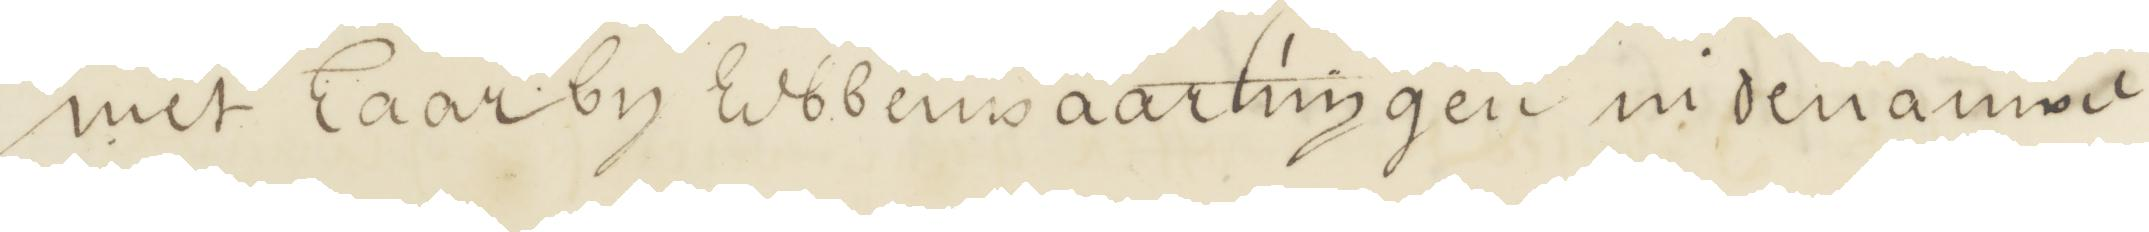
met haar by hebben vaartuijgen in den auwe
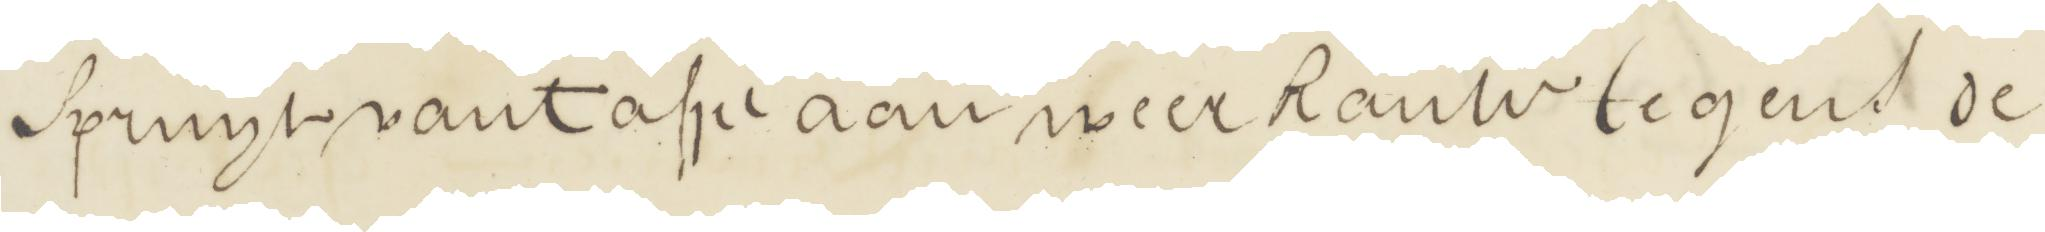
spruijt van Casje aan weer kante tegens de
